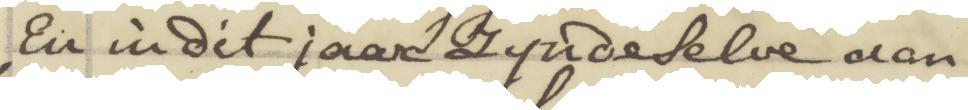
En in dit jaar zyn deselve aan
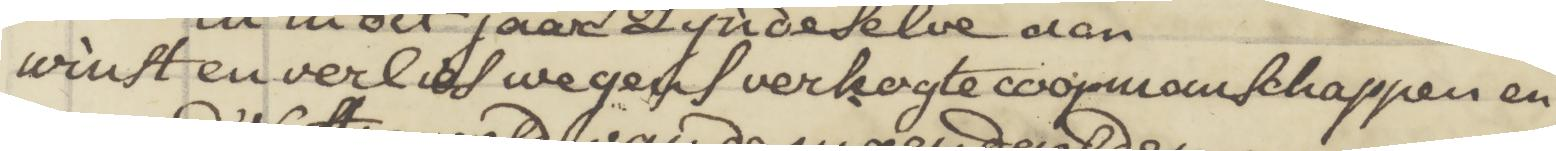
winst en verlies wegens verkogte coopmanschappen en
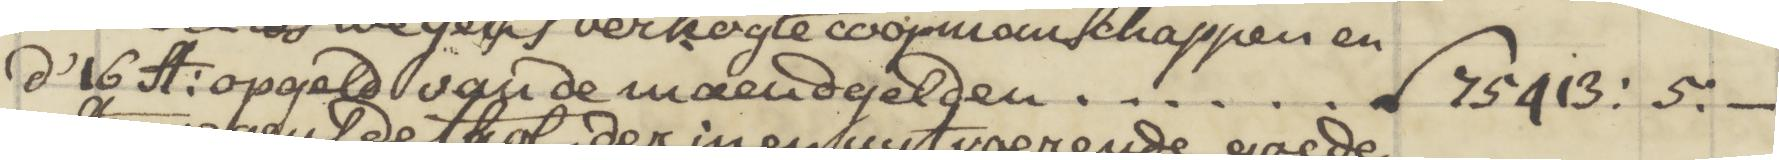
d'16 st: opgeld van de maendgelden . . . . . . ƒ75413: 5: —
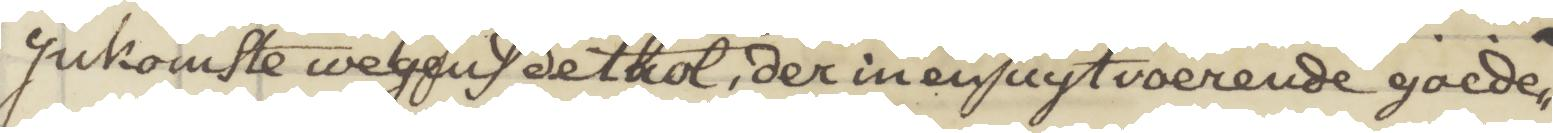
Jnkomste wegens de thol, der in en uyt voerende goede
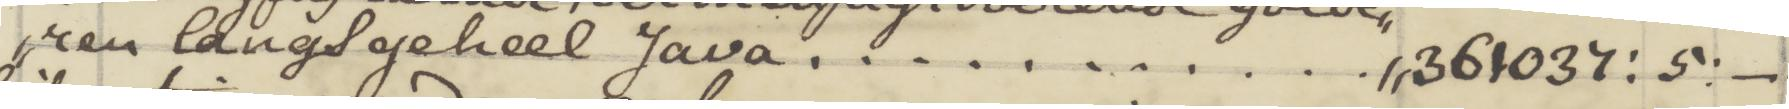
ren langs geheel Java . . . . . . . . . . . „ 361037: 5: —
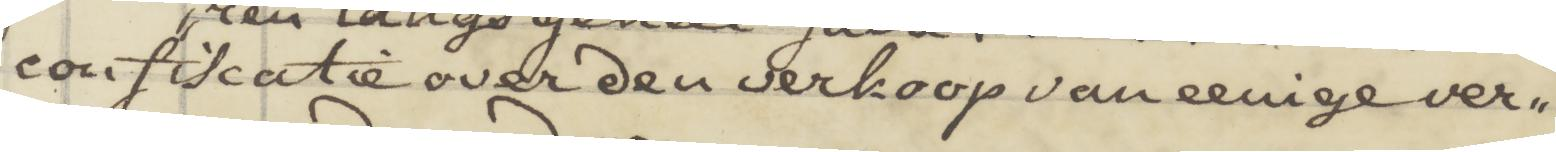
confiscatie over den verkoop van eenige ver„
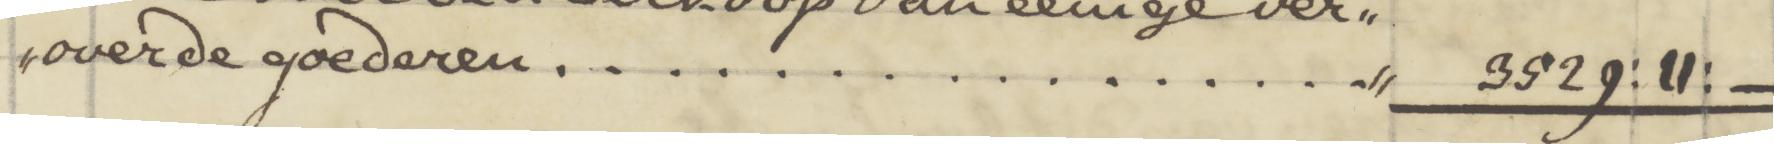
„overde goederen . . . . . . . . . . . . . . . .„ 3529: 11: —
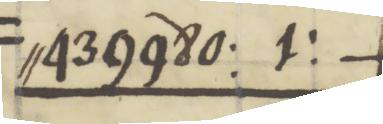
„439980: 1: —
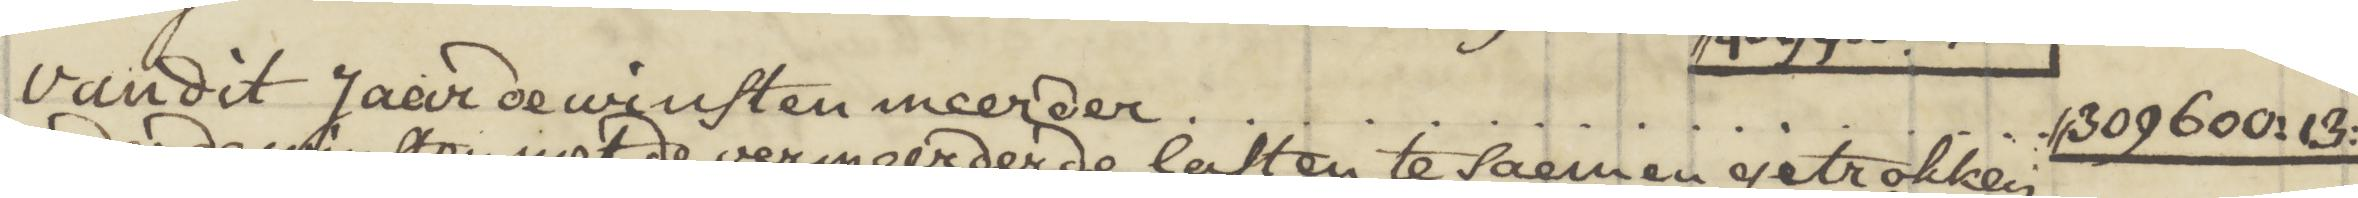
van dit Jaar de winsten meerder . . . . . . . . . . . . . . . . . „309600: 13:
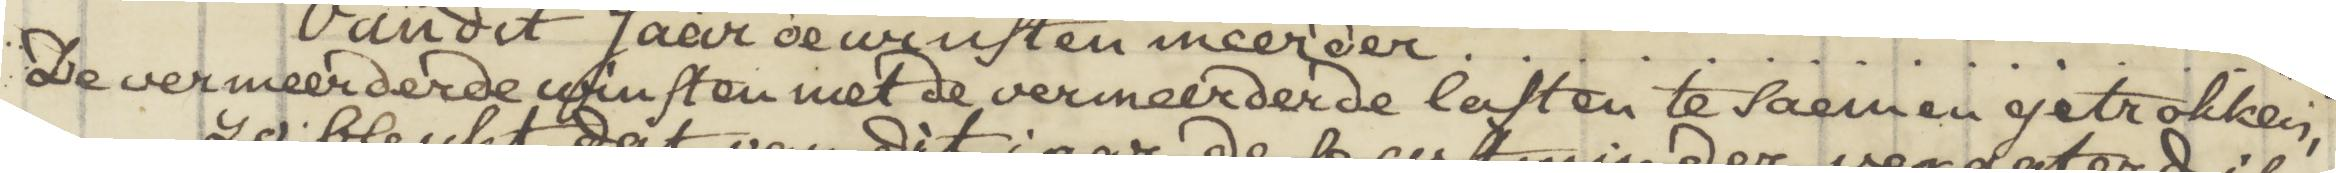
De vermeerderde winsten met de vermeerderde lasten te saemen getrokken,
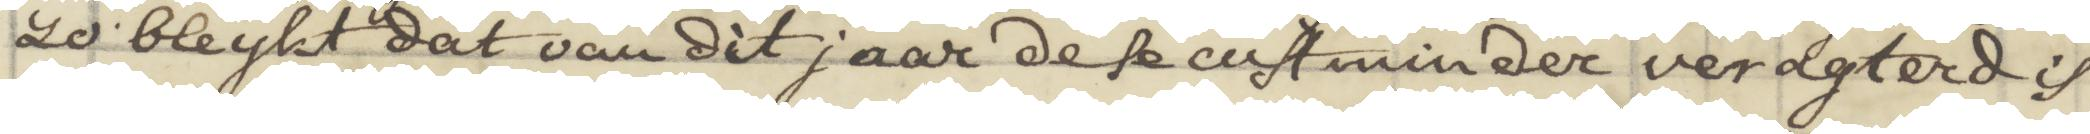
zo bleykt dat van dit jaar dese cust minder veragterd is
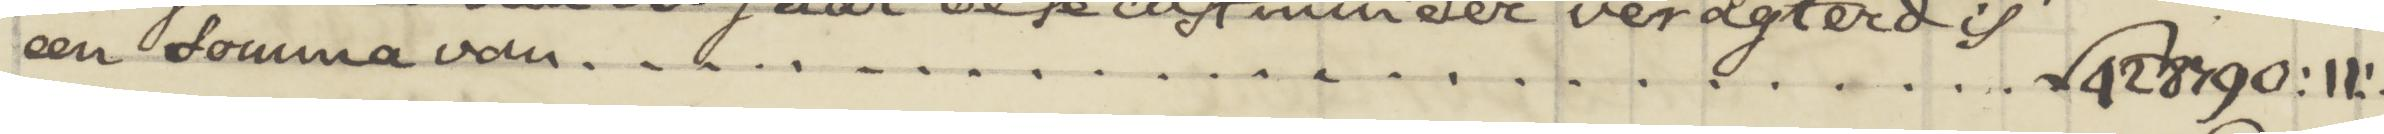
een somma van . . . . . . . . . . . . . . . . . . . . . . . . . . ƒ428790: 11:
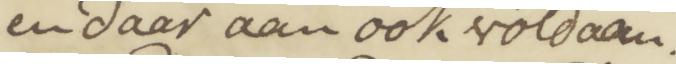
en daar aan ook voldaan
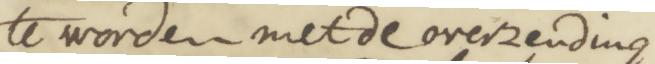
te worden met de overzending
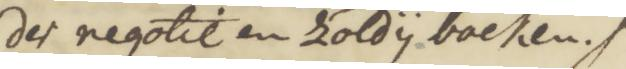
der negotie en zoldij boeken.
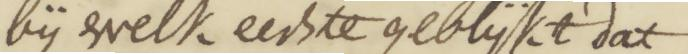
bij welk eerste geblijkt dat
